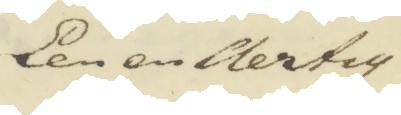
Een en dertig
